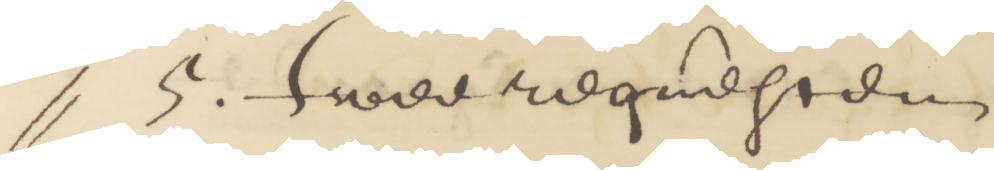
„ 5. twee requesten
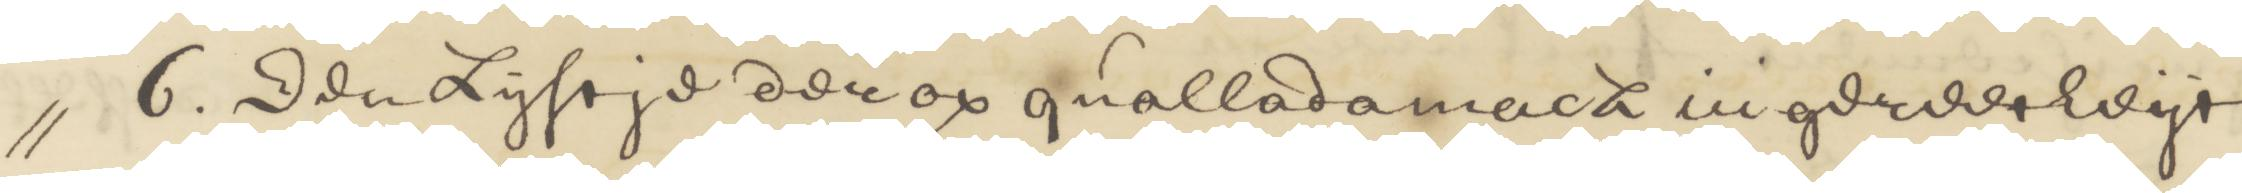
„ 6. Een lijstje der op qualladamack in gereetheijt
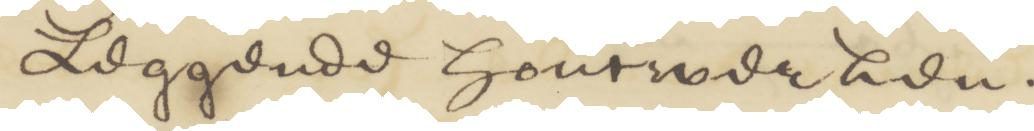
leggende houtwerken
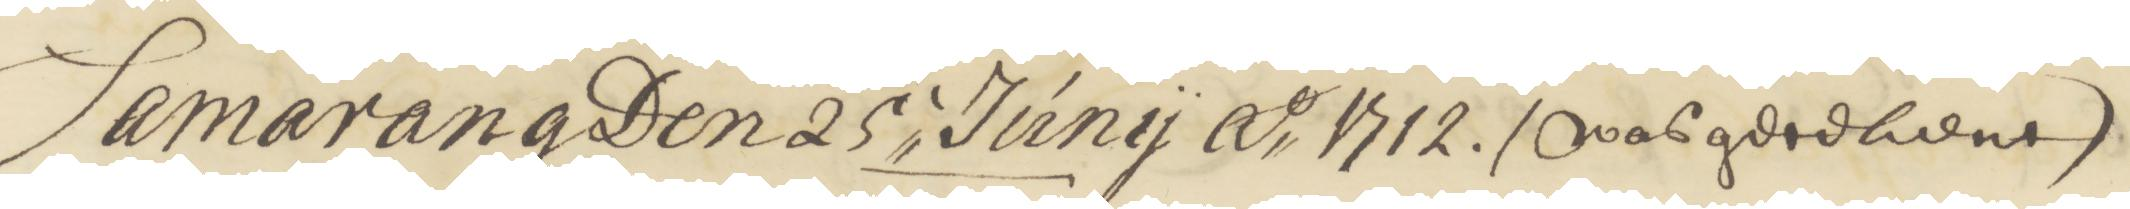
Samarang Den 25„' Junij a„o 1712. /was getekent/
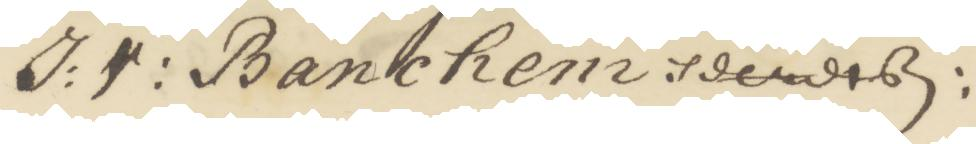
J: V: Banchem secretsz:
